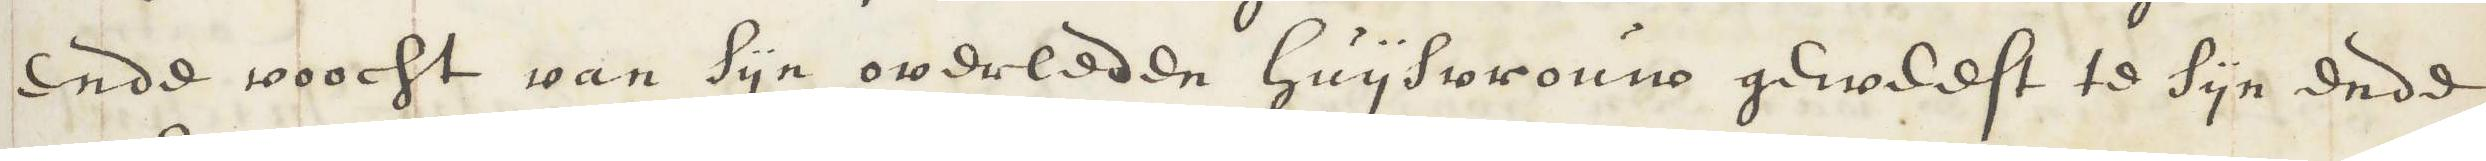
ende voocht van sijn overleden huijsvrouw geweest te sijn ende
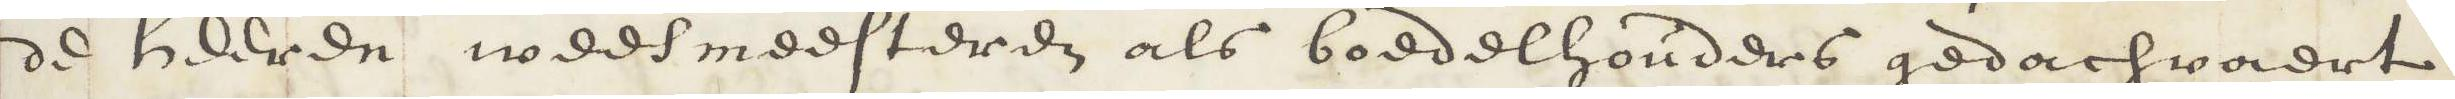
de heeren weesmeesteren als boedelhouders gedachvaert
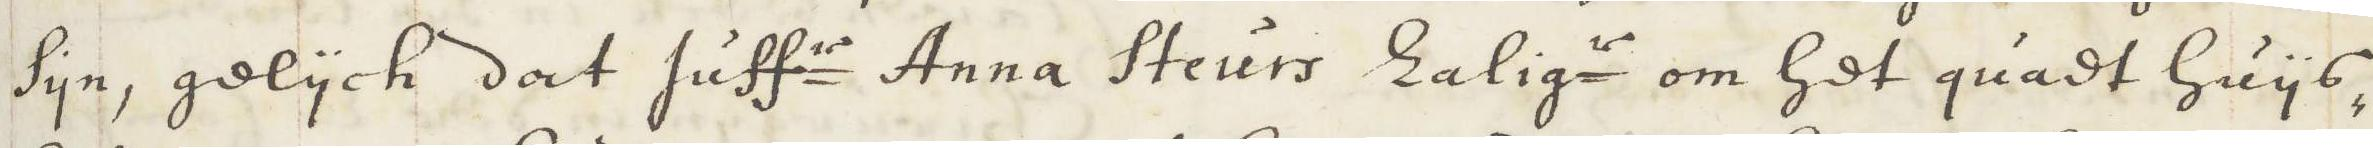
sijn, gelijck dat juff=r Anna steurs halig=r om het quaet huijs„
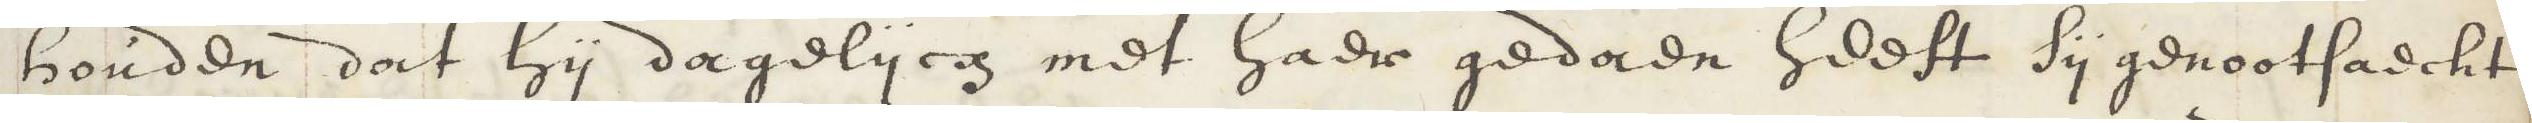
houden dat hij dagelijcx met haer gedaen heeft sij genootsaeckt
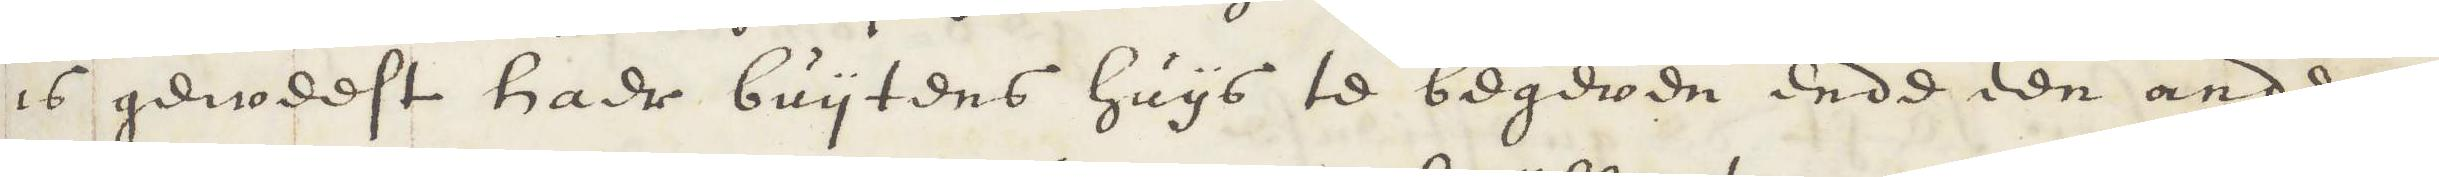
is geweest haer buijtens huijs te begeven ende een ander
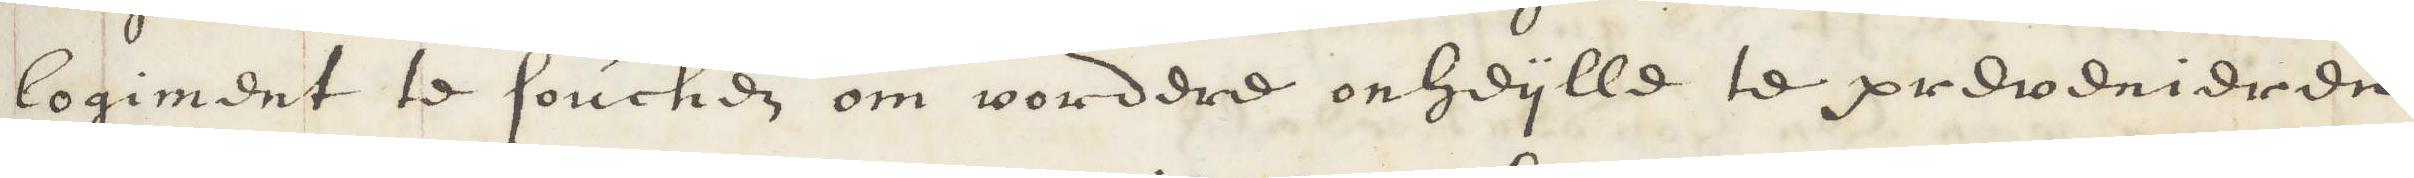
logiment te soucken om vordere onheijlle te prevenieren
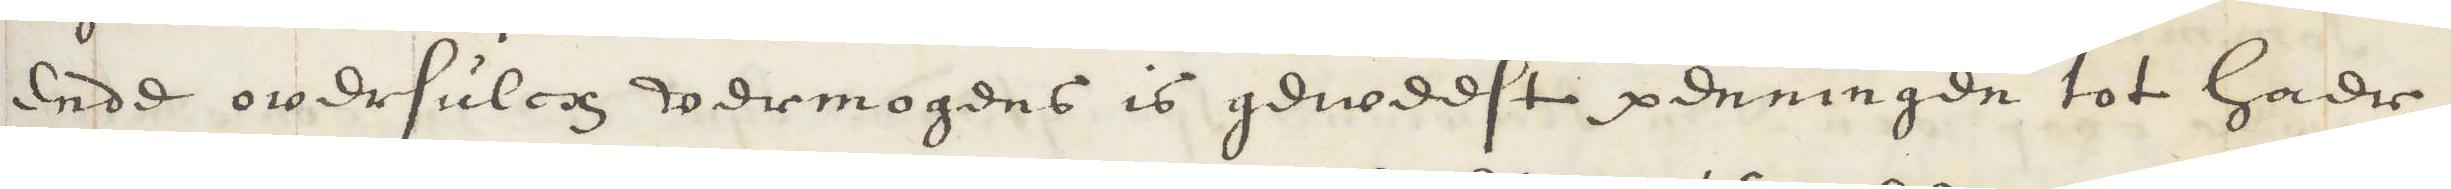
Ende oversulcx vermogens is geweest penningen tot haer
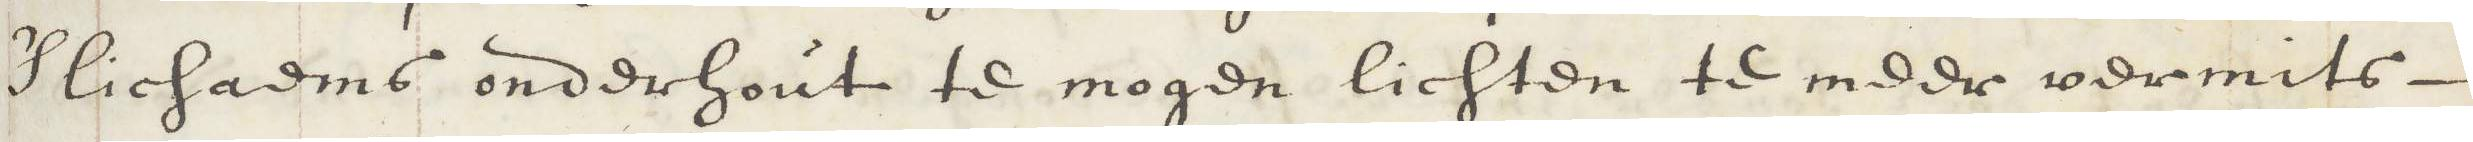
's lichaems onderhout te mogen lichten te meer vermits —
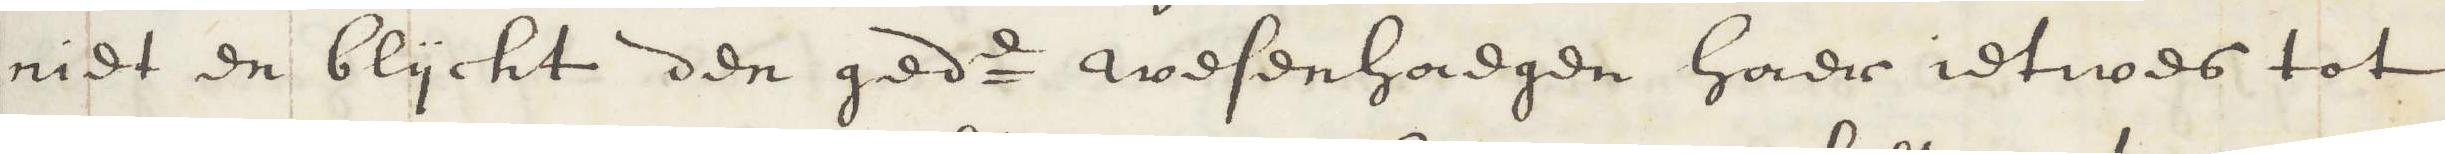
niet en blijckt den ged=e wesenhaegen haer ietwes tot
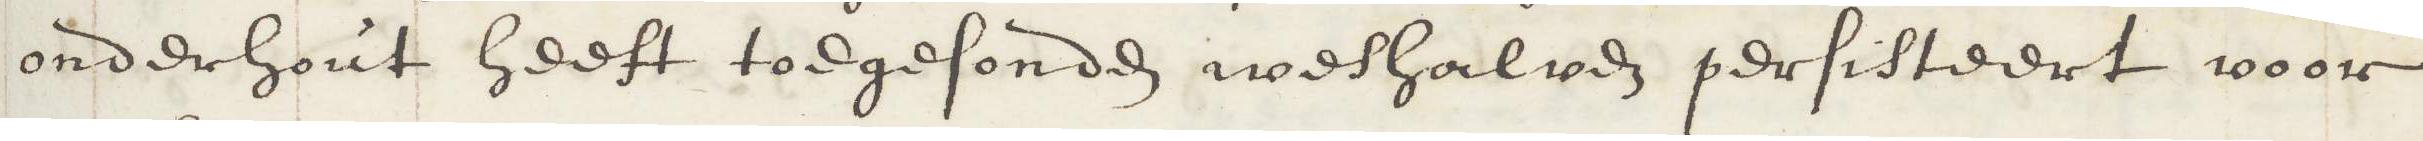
onderhout heeft toegesonden weshalven persisteert voor
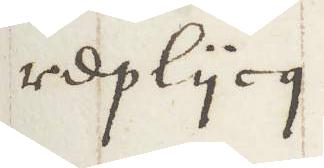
replijcq
